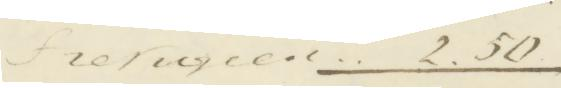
Treregeen 2.50
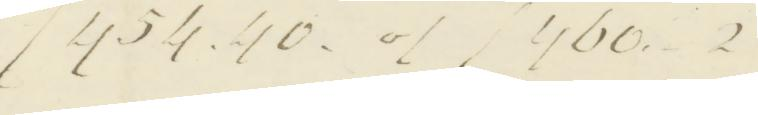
ƒ 454.40. of ƒ 460.2
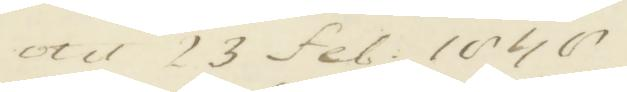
otel 23 Feb. 1848
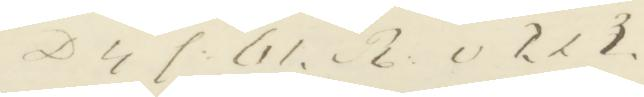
D 4 l: 41. R:o 21 3.
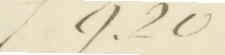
ƒ 9.20
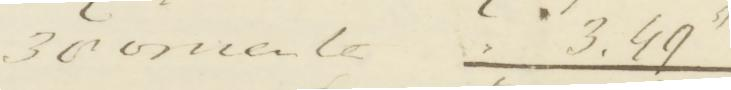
38 omente 3. 49 51
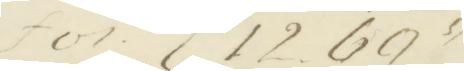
tot. ƒ 12.69 51
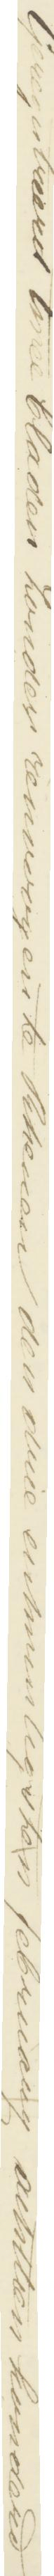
Geregistreerd twee bladen honder renvoogen te Rhenen den drie entwintigsten februarij achttien honderd
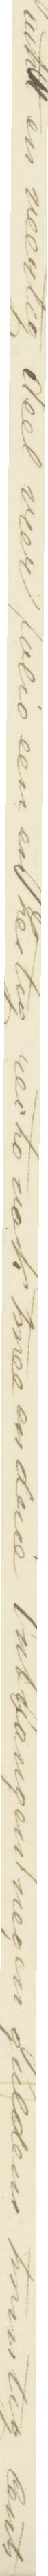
uitot en veertig, deel vier folio een en zestig, recto vok twee en drie Ontvangen negen gulden twintig, Cents
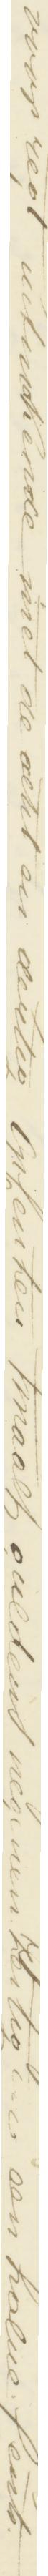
voor regt uitwakende met de actet en dertig Opcenten twaalf guldens negenen zestig een een halven Cents.
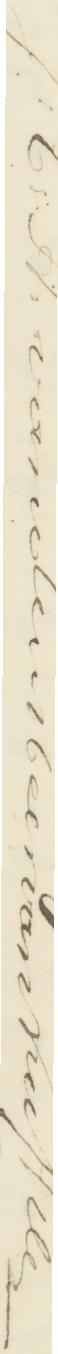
J. br. Arreveen den Heer van Kuffelen
